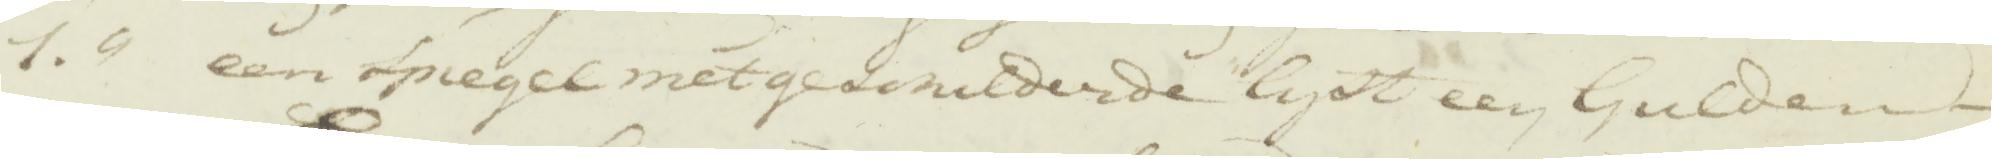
1. „ een spiegel met geschilderde lijst een Gulden
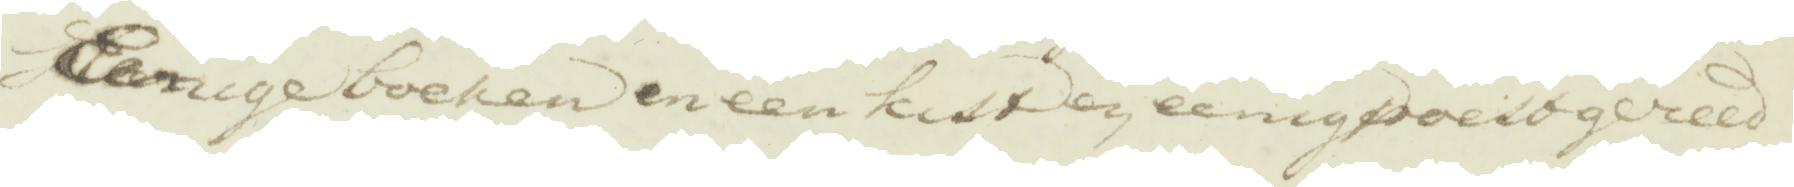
Eenige boeken en een kist en eenig poestgereed
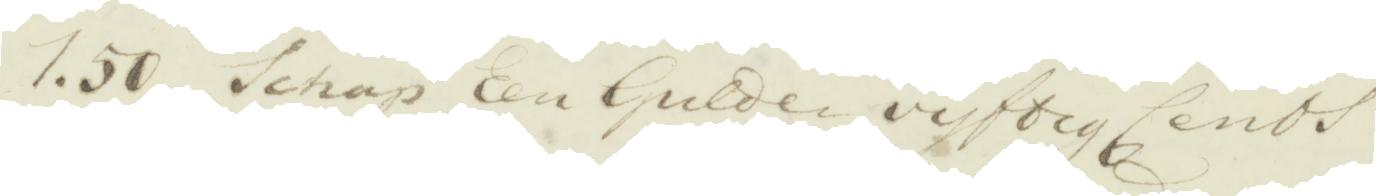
1.50 schap Een Gulden vyftig Cents
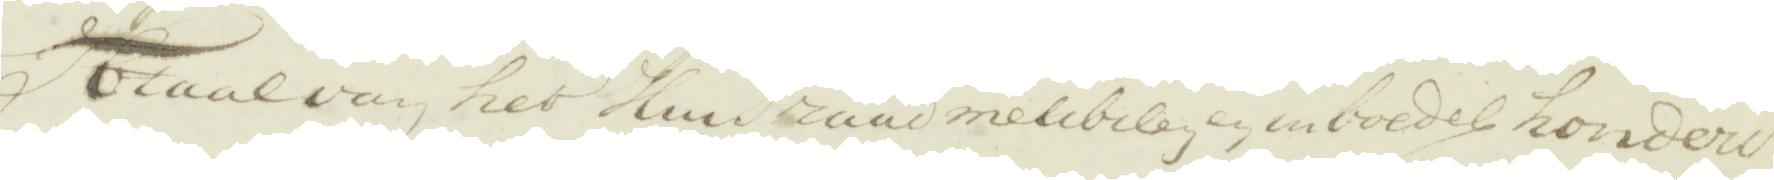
Totaal van het Huisraad meubelen en inboedel honderd
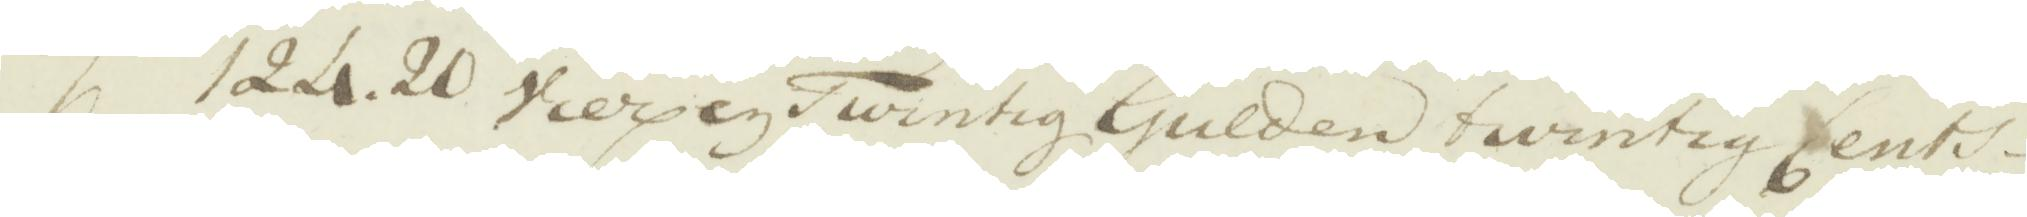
ƒ 124.20 Vier en Twintig Gulden twintig Cents
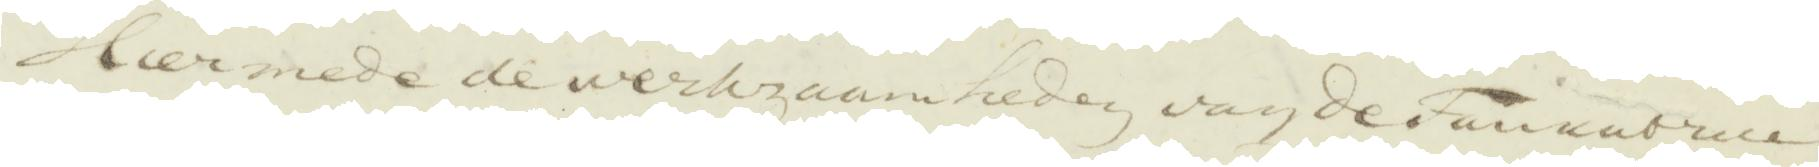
Hiermede de werkzaamheden van de Tauxatrice
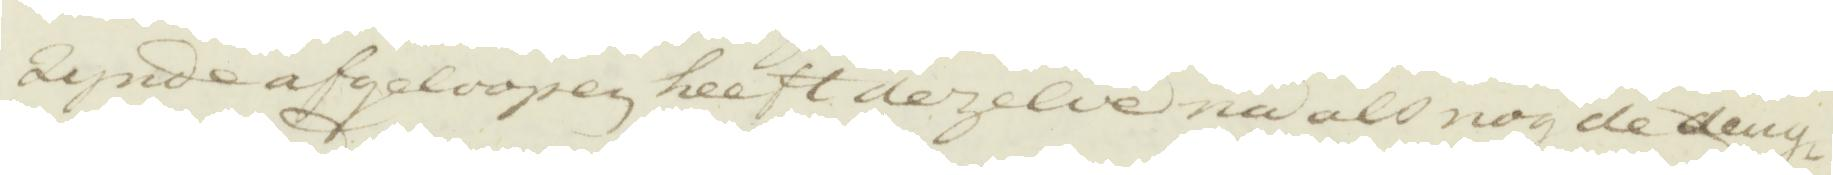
zynde afgeloopen heeft dezelve na als nog de deug„
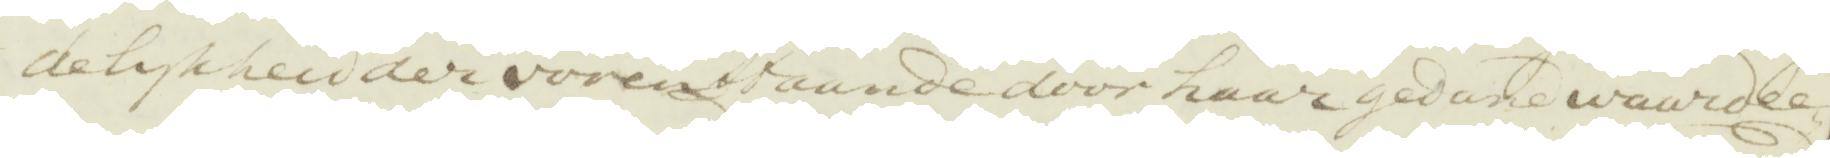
delykheid der vorenstaande door haar gedane waardee
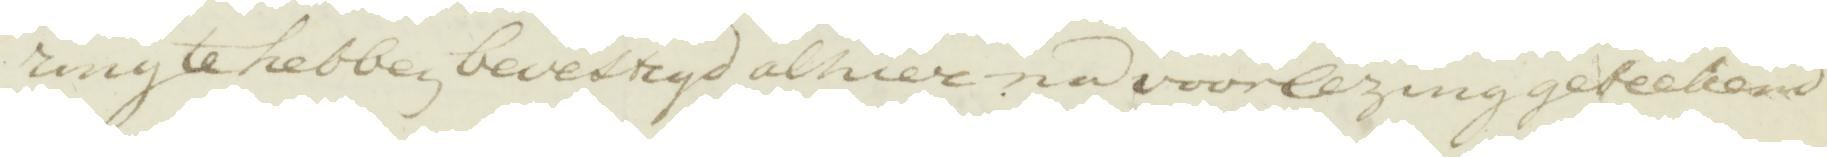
ring te hebben bevestigd alhier na voorlezing geteekend
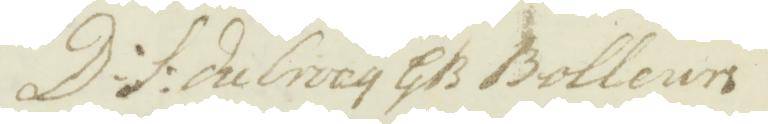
D:S: du Crocq GB Bolleurs
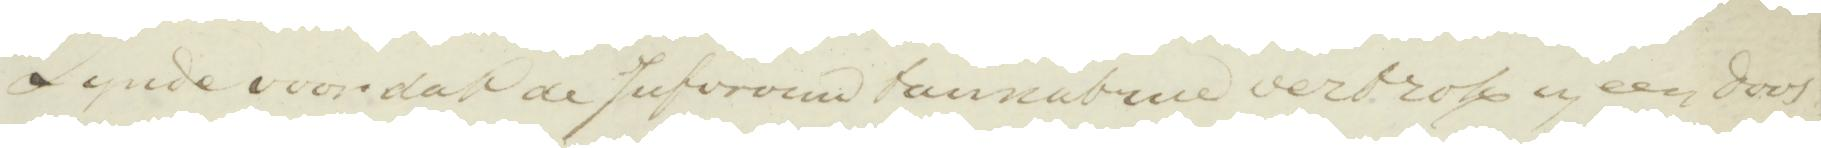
Zynde voordat de Jufvrouw tauxatrice vertrok in een doos
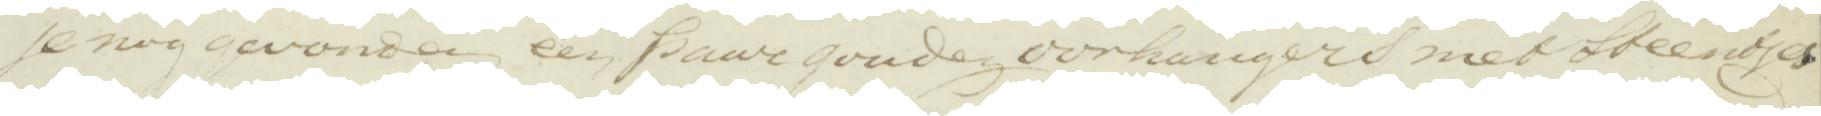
je nog gevonden een paar gouden oorhangers met steentjes
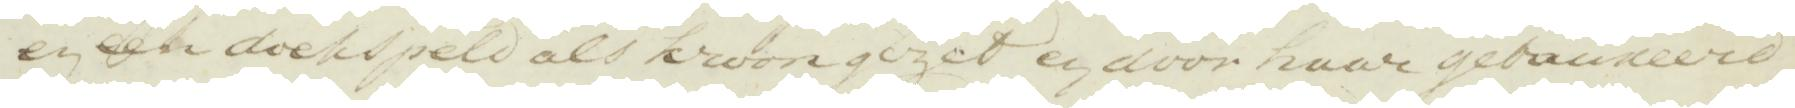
en een doekspeld als kroon gezet en door haar getauxeerd
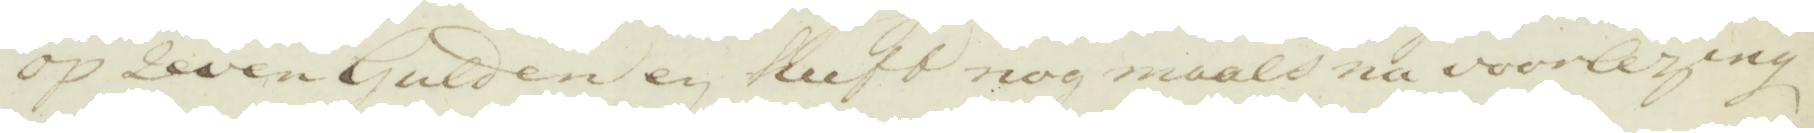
op zeven Gulden en heeft nog maals na voorlezing
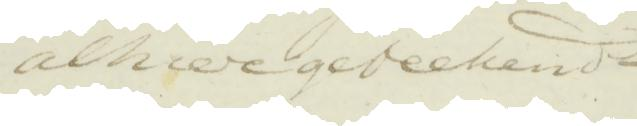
alhier geteekend=
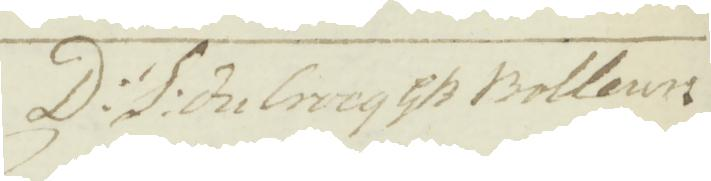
D: S: du Crocq GB Bolleurs
